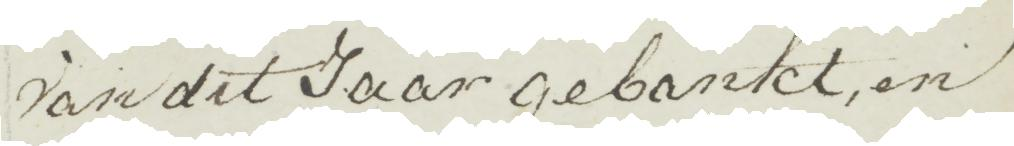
van dit Iaar gebankt, en
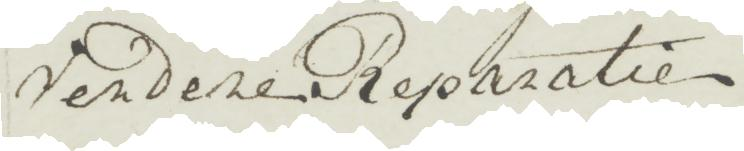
verdere Reparatie
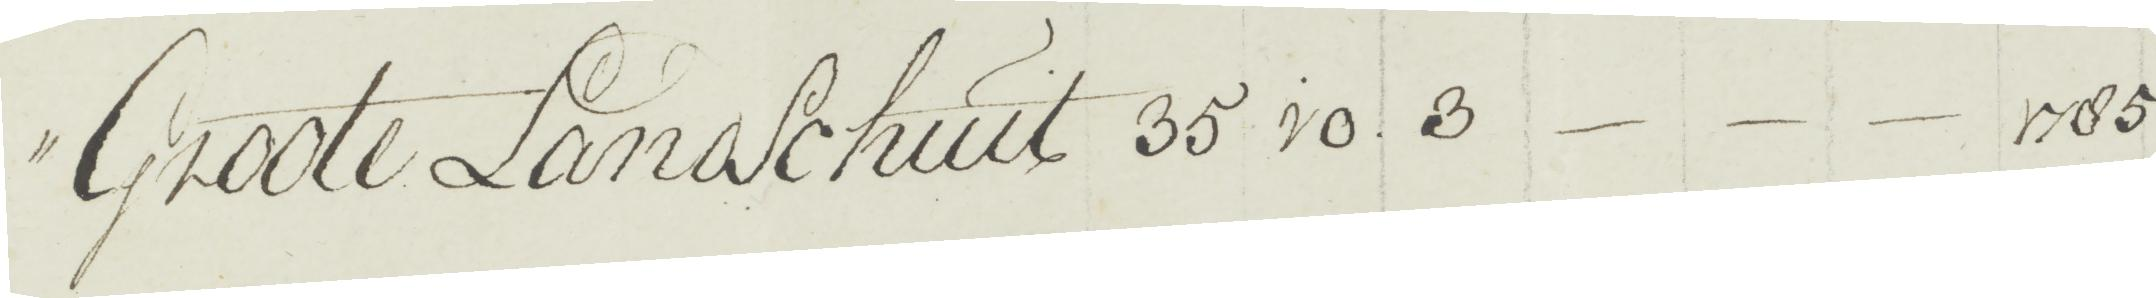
„ Groote Landschuit 35 10. 3 — — — 1785
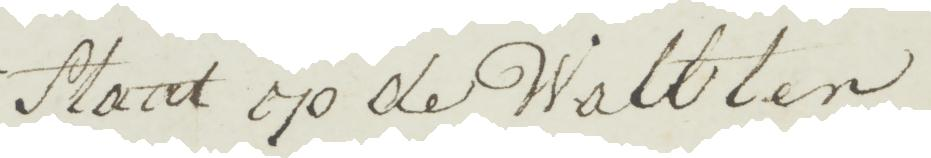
staat op de Wall ten
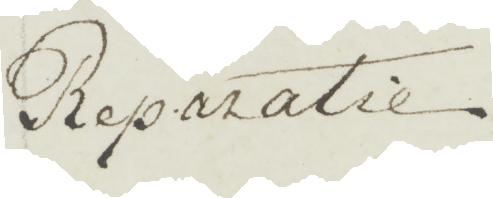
Reparatie
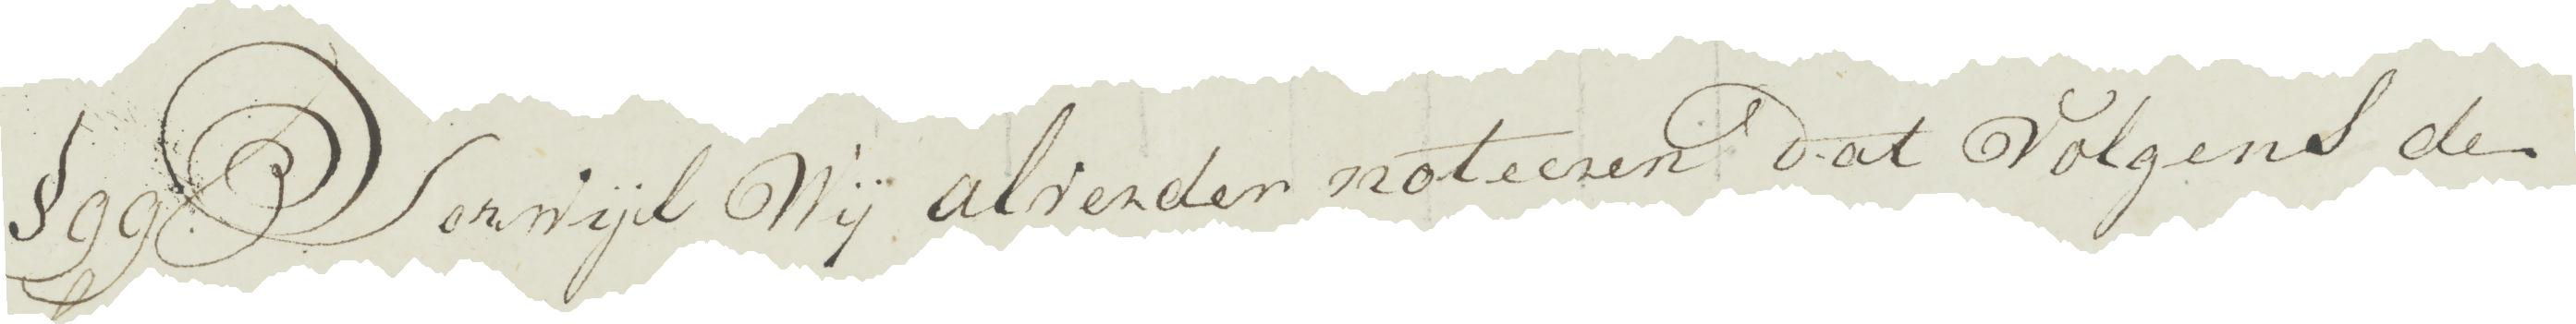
§99 Terwijl wij alverder noteeren, dat volgens de
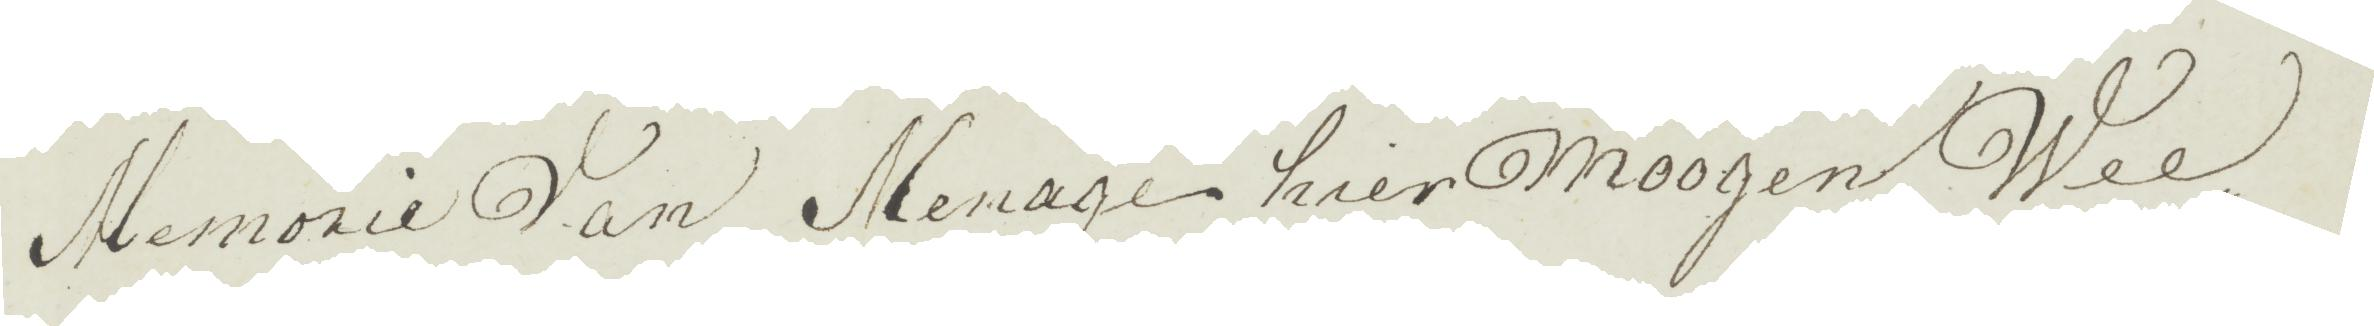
Memorie Van Menage hier moogen Wee
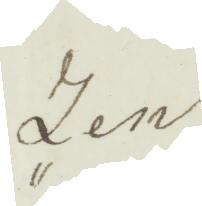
„zen
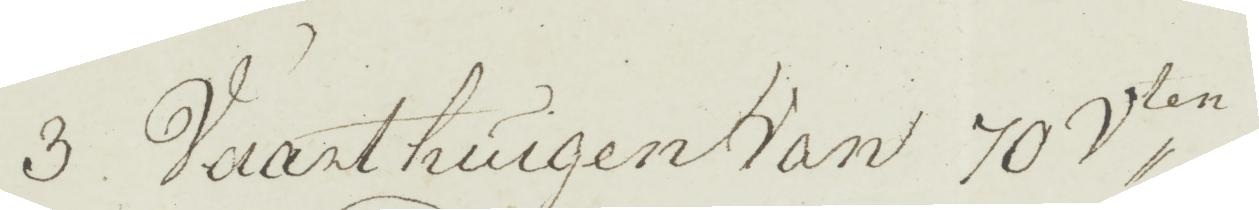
3. Vaarthuigen van 70 V„ten
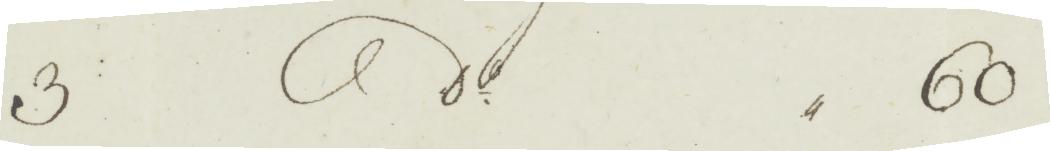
3 d„o „ 60
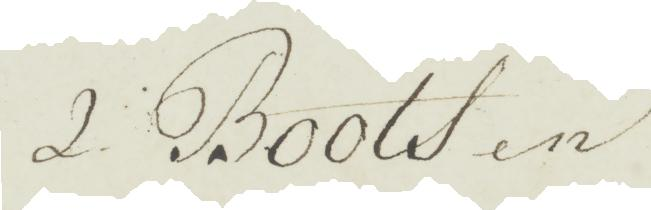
2. Boots en
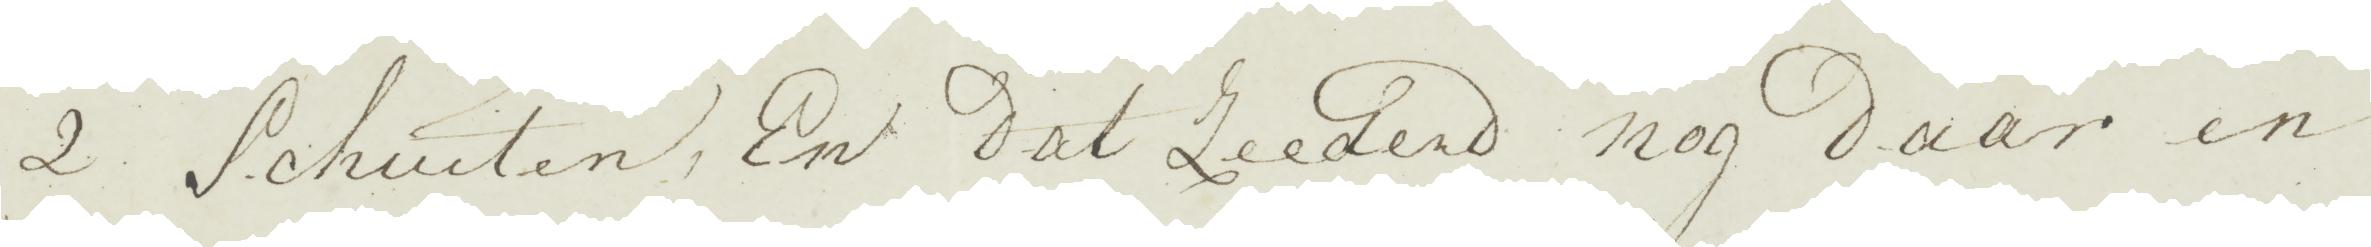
2 Schuiten, En dat zeederd nog daar en
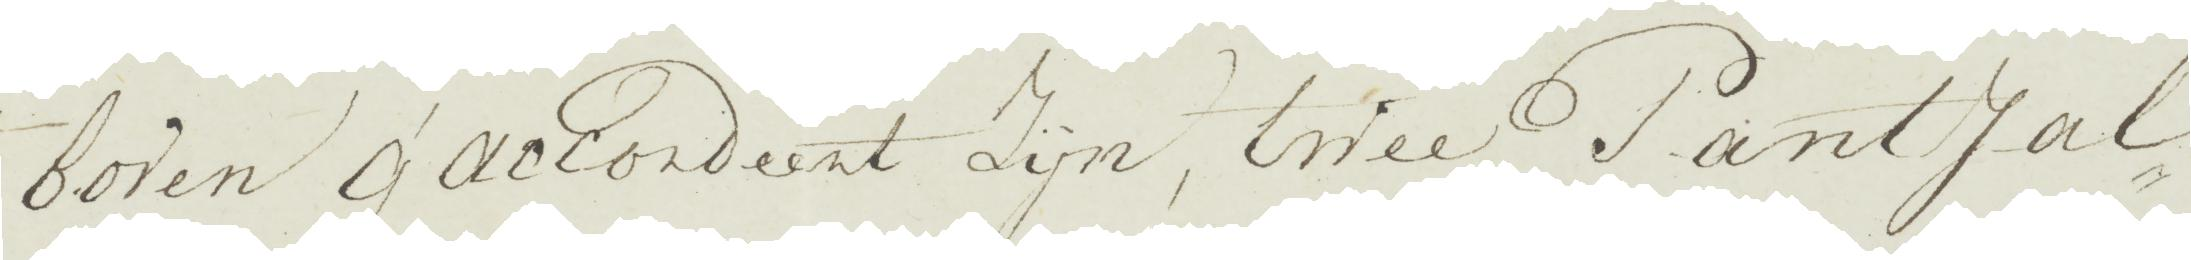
boven g’accordeert zijn, twee Pantjal=
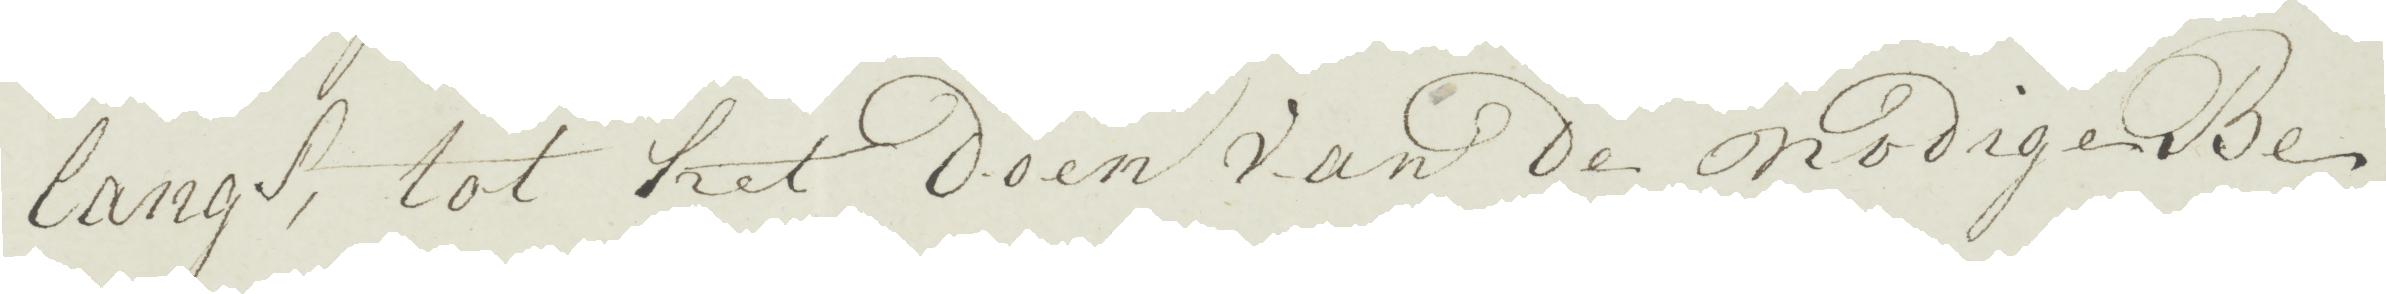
langs, tot het doen van de nodige Be
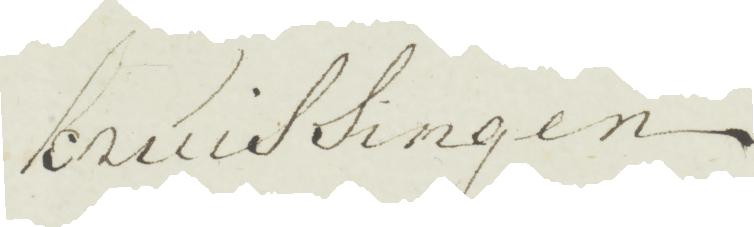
kruissingen
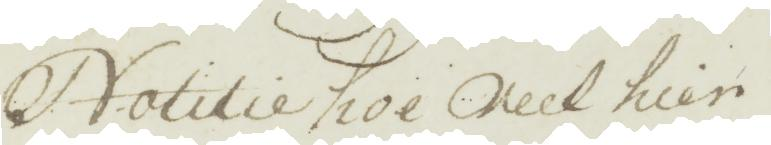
Notitie hoe veel hier
